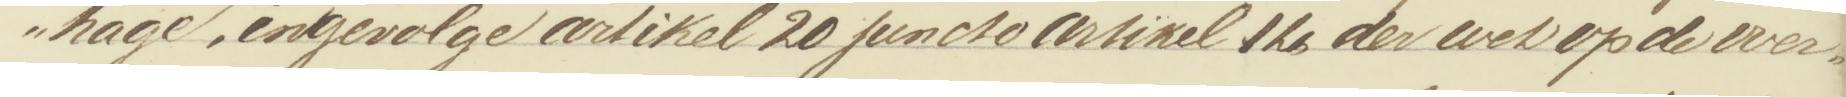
„hage, ingevolge artikel 20 juncto artikel 14 der wet op de over
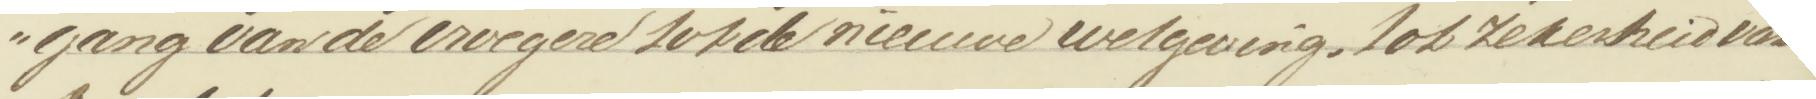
„gang van de vroegere tot de nieuwe wetgeving, tot zekerheid van
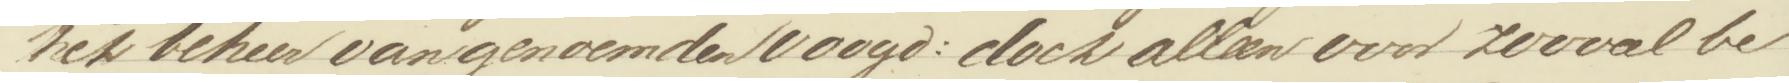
het beheer van genoemden voogd: doch alleen voor zooveel be
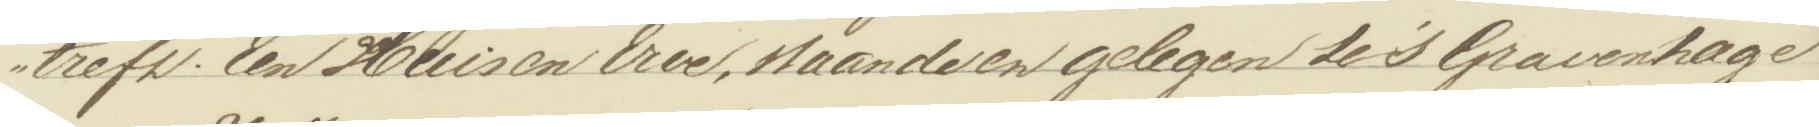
„treft. Een Huis en Erve, staande en gelegen te ´s Gravenhage
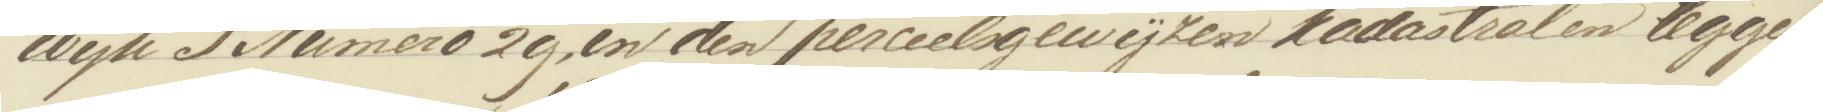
Wijk I Numero 29, in den perceelsgewijzen kadastralen legger
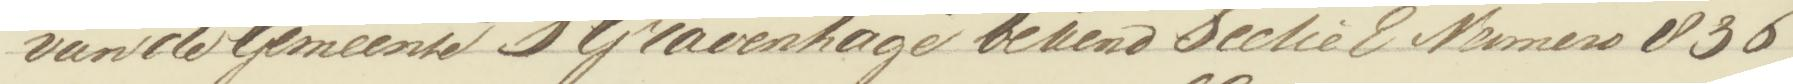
van de Gemeente 'SGravenhage bekend Sectie E Numero 836
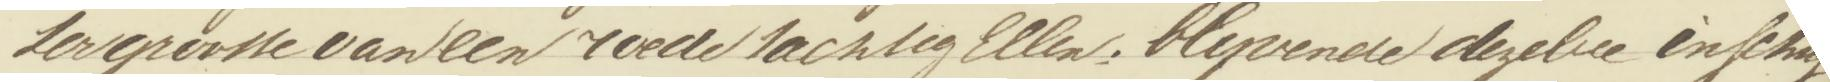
ter grootte van een roede tachtig Ellen, blyvende dezelve inschry
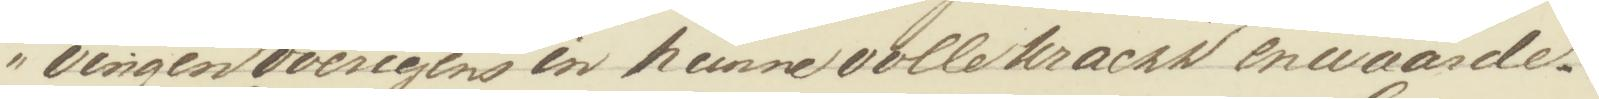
„vingen overigens in hunne volle kracht en waarde.
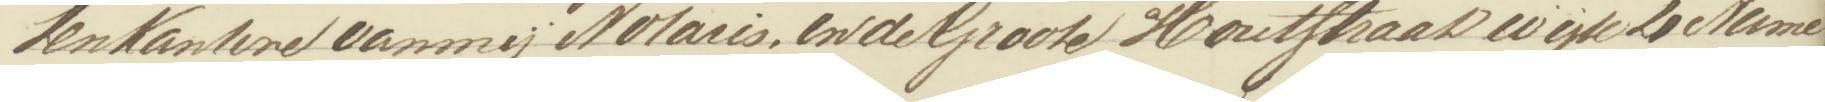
ten kantore van mij Notaris, in de Groote Houtstraat wijk 4 Nume
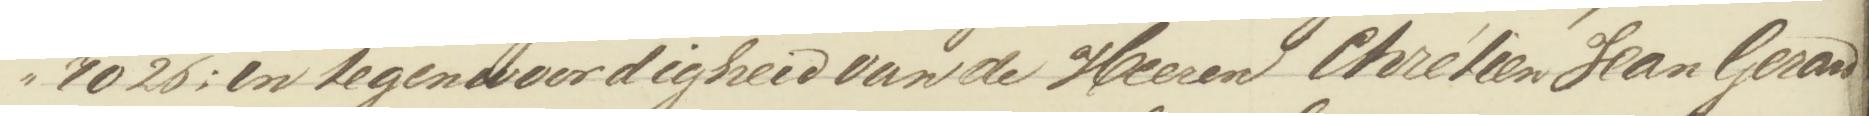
„ ro 26; in tegenwoordigheid van de Heeren Chrétien Jean Gerard
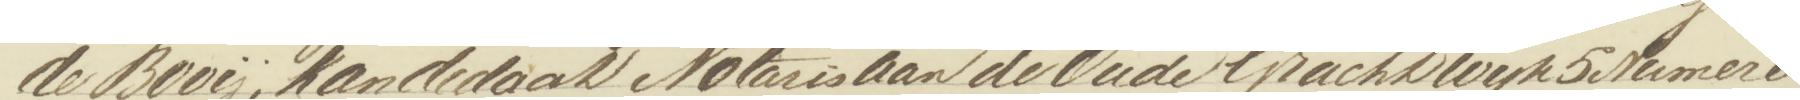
de Booij, Kandidaat Notaris aan de Oude Gracht wyk 5 Numero
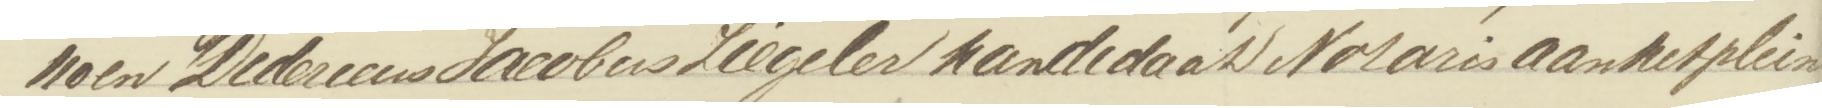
110 en Didericus Iacobus Ziegeler kandidaat Notaris aan het plein
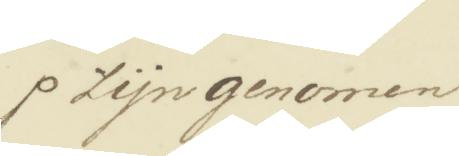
¶ zijn genomen
